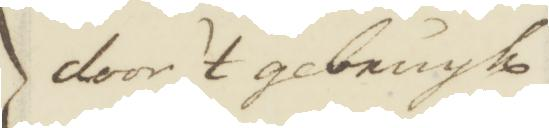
door ’t gebruyk
